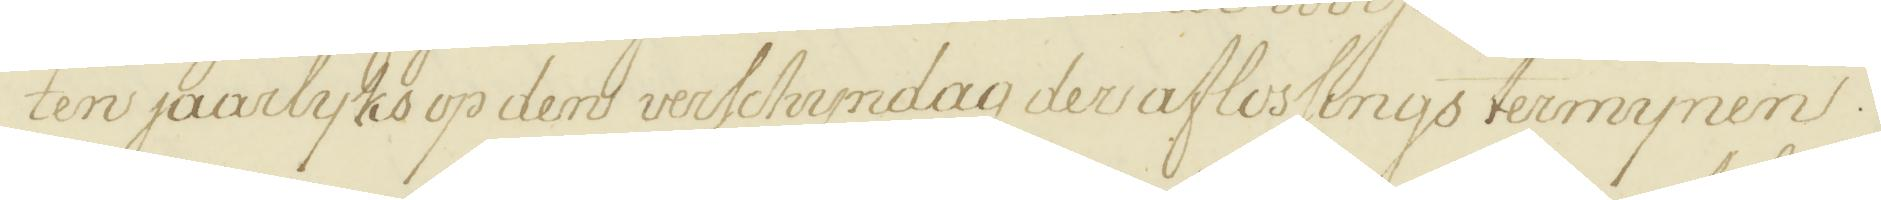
ten jaarlyks op den verschyndag der aflossings termynen.
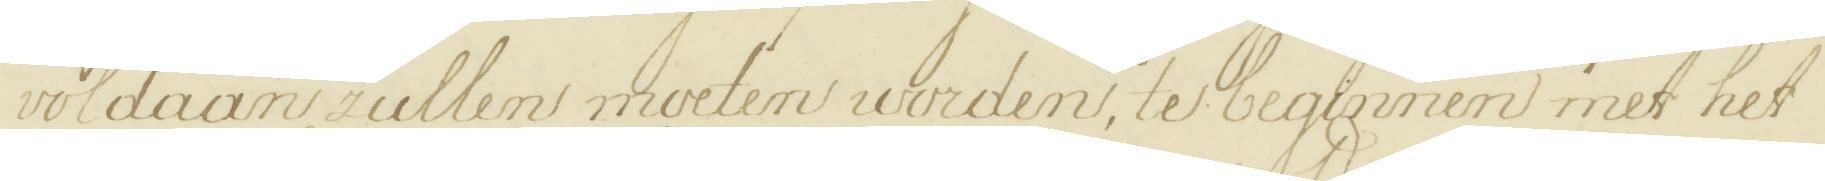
voldaan zullen moeten worden, te beginnen met het
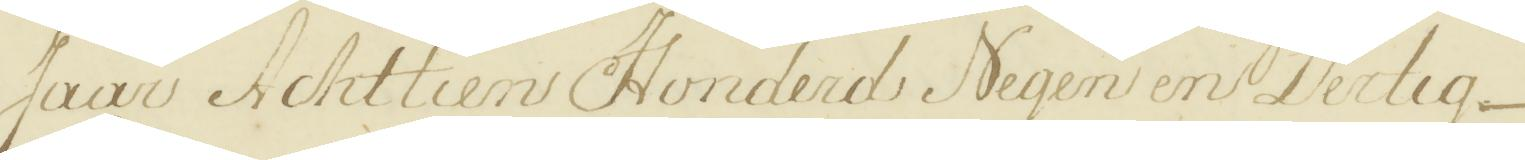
Jaar Achttien Honderd Negen en Dertig.
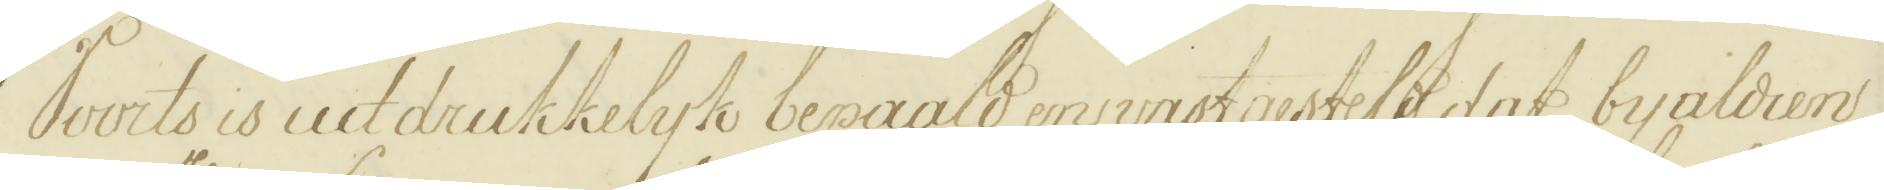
Voorts is uitdrukkelyk bepaald en vast gesteld, dat by aldien
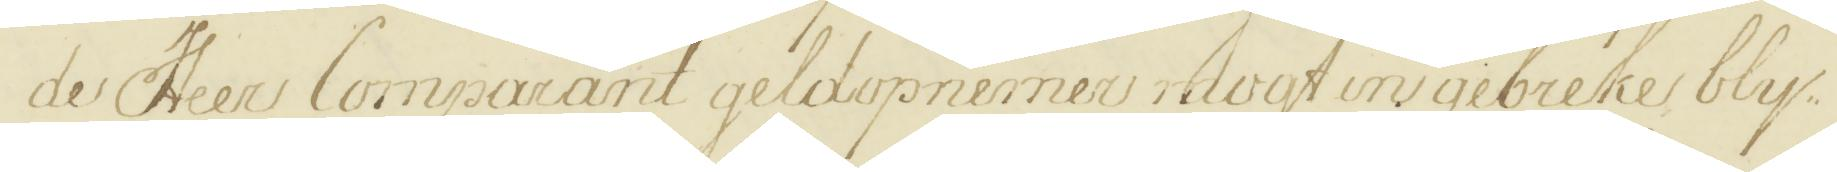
de Heer Comparant geldopnemer mogt in gebreke bly„
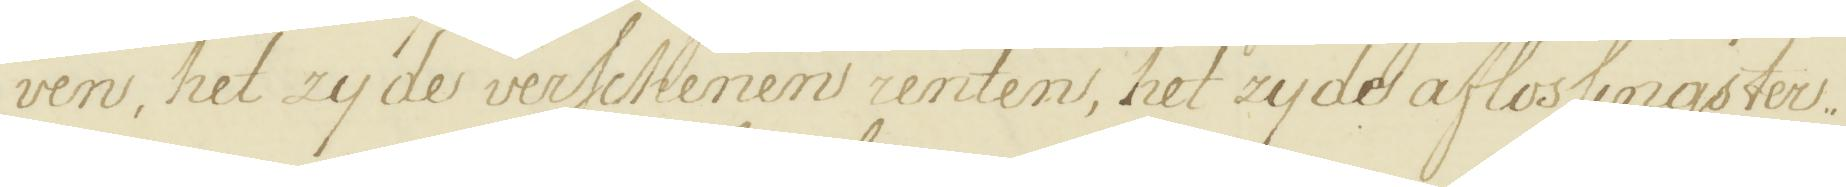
ven, het zy de verschenen renten, het zy de aflossingster„
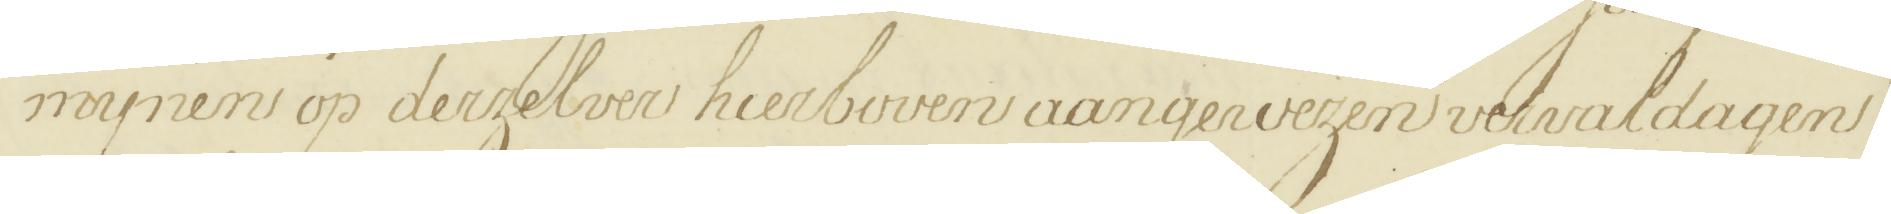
mynen op derzelver hierboven aangewezen vervaldagen
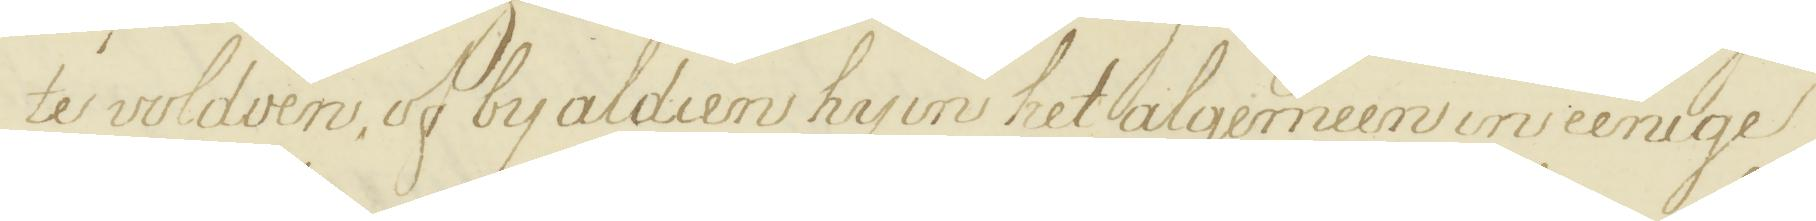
te voldoen, of by aldien hy in het algemeen in eenige
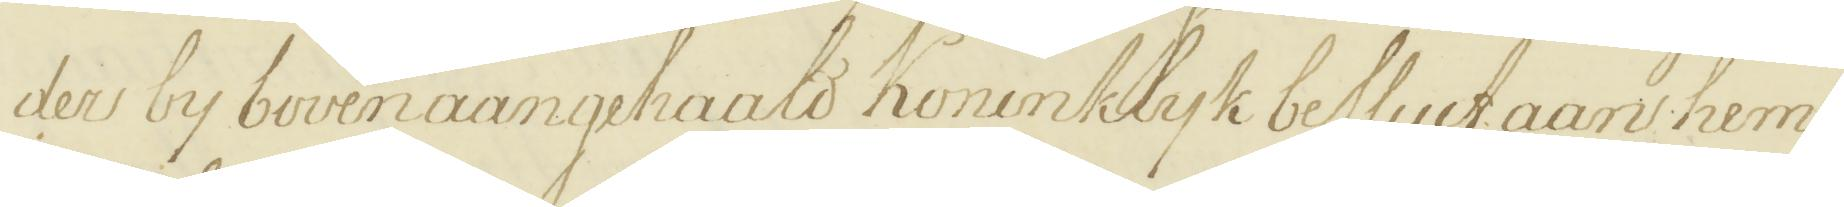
der by boven aangehaald koninklyk besluit aan hem
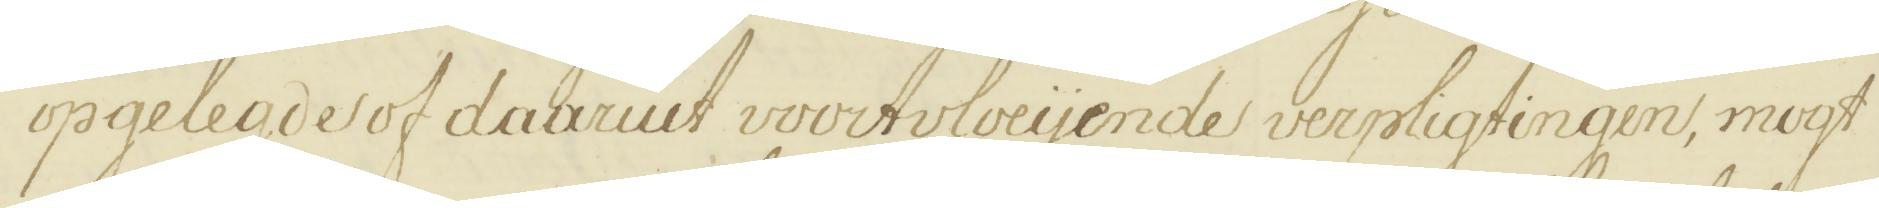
opgelegde of daaruit voortvloeijende verpligtingen, mogt
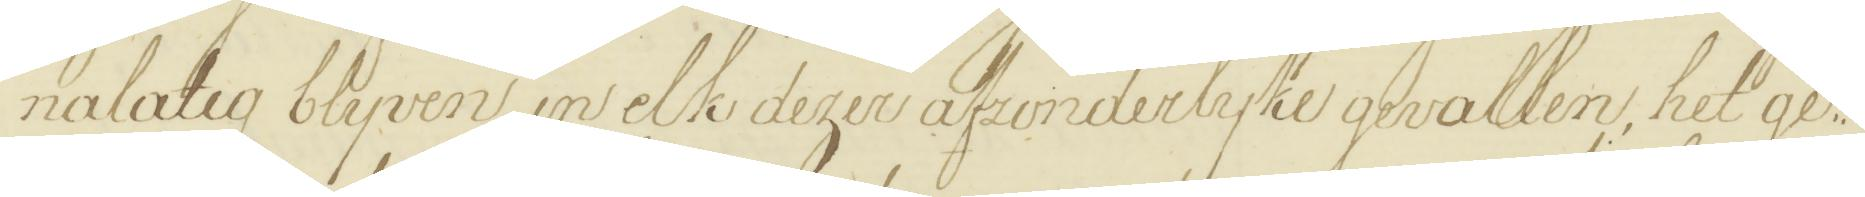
nalatig blijven in elk dezen afzonderlyke gevallen, het ge„
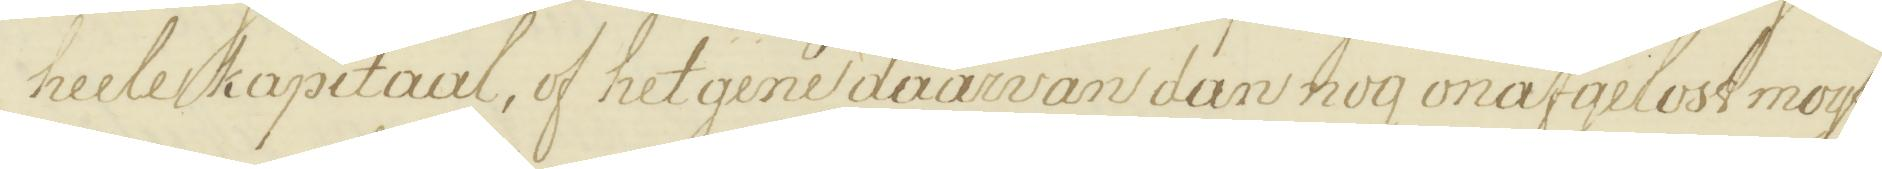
heele kapitaal, of het gene daarvan dan nog onafgelost mogt
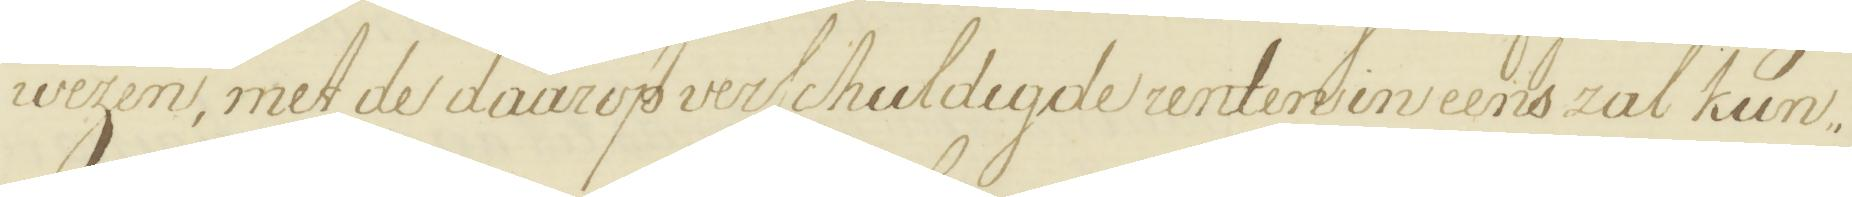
wezen, met de daarop verschuldigde renten in eens zal kun„
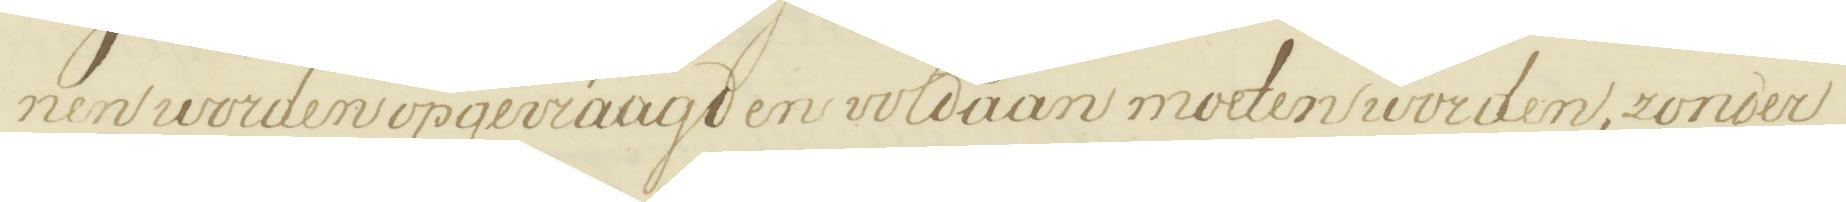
nen worden opgevraagd en voldaan moeten worden, zonder
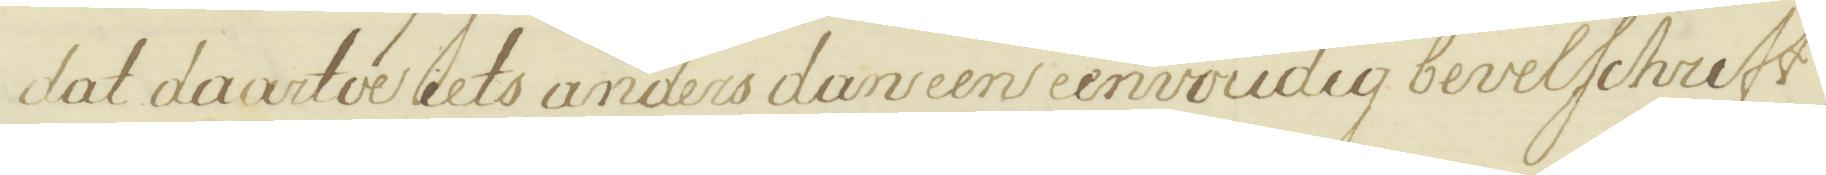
dat daartoe iets anders dan een eenvoudig bevelschrift
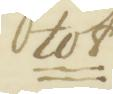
tot
